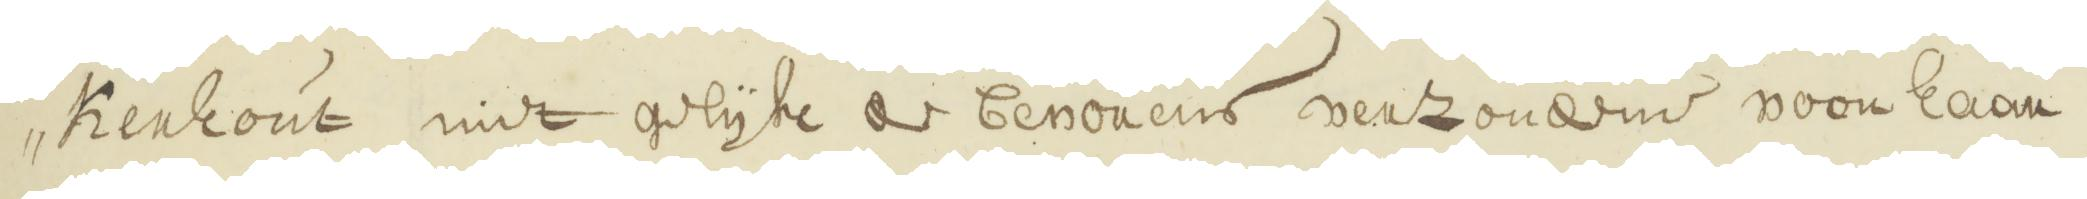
„kerhout niet gelijk de bevorens verzondene voor haar
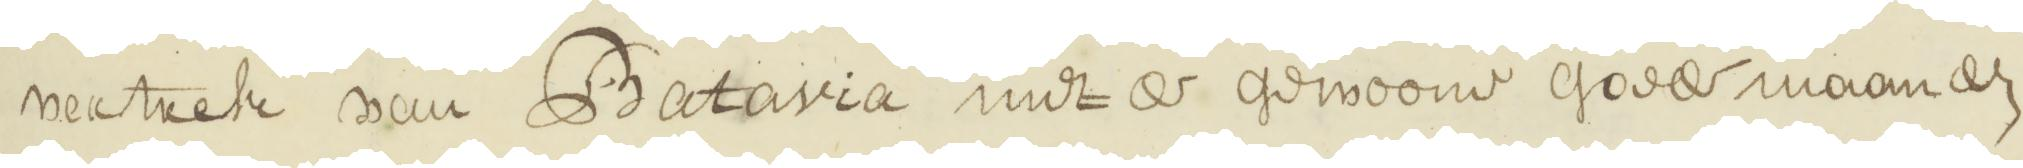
vertrek van Batavia met de gewoone goede maan den
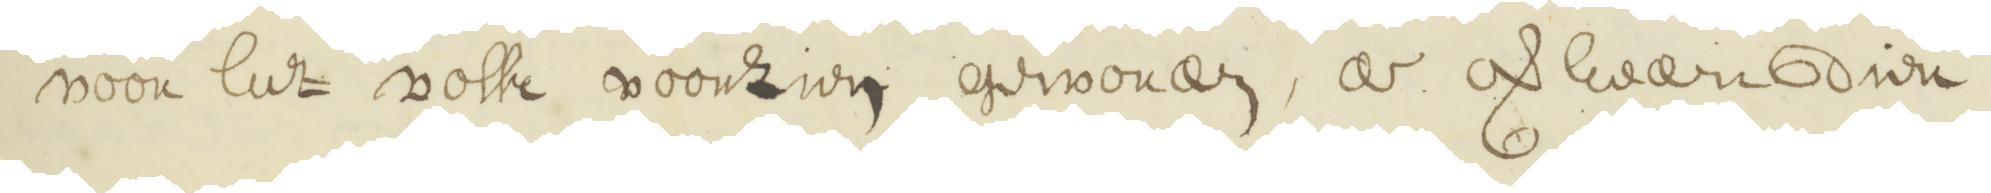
voor het volk voorzien geworden, de overheden dien
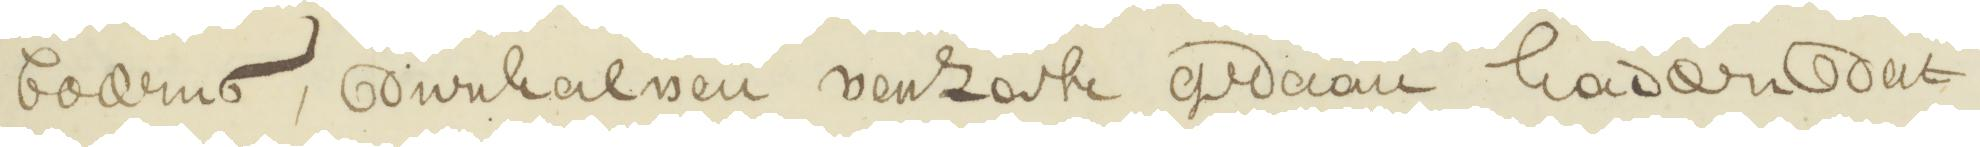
bodems, dierhalven verzoek gedaan hadden dat
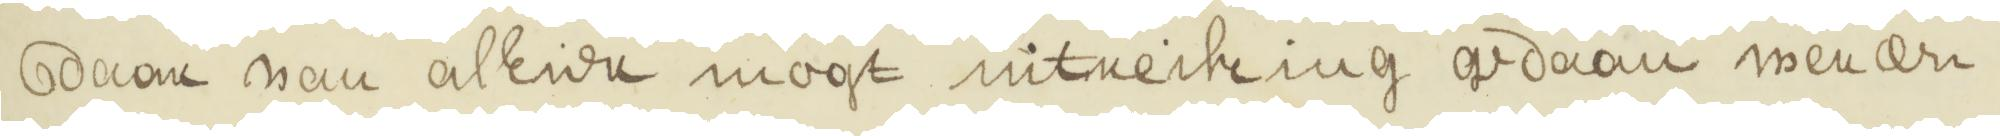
daar van alhier mogt uitreiking gedaan werden
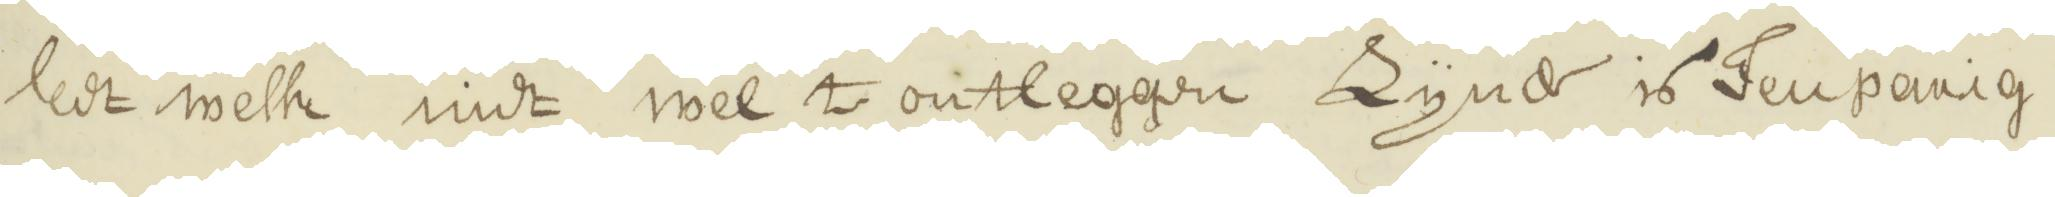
het welk niet wel te ontleggen zijnde is Eenparig
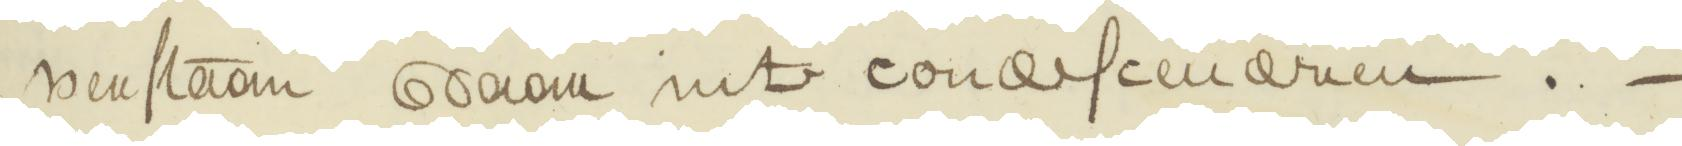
verstaan daar inte condescenderen.
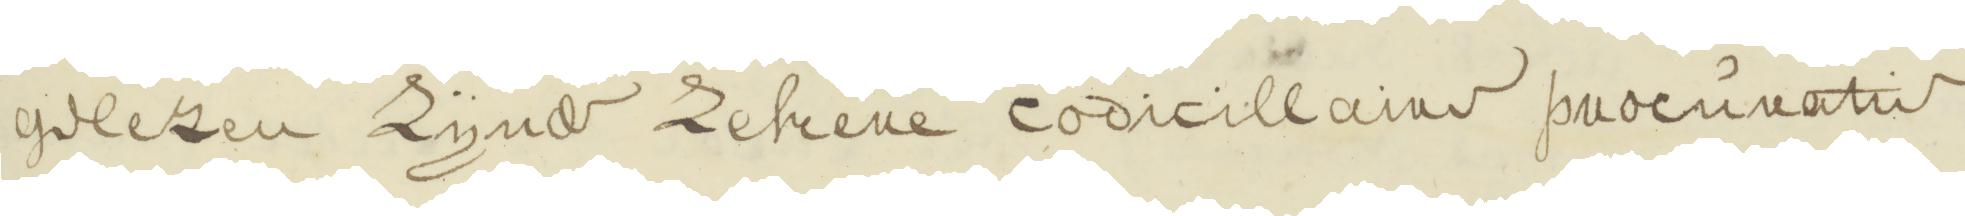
gelezen zijnde zekere codicillaire procuratie
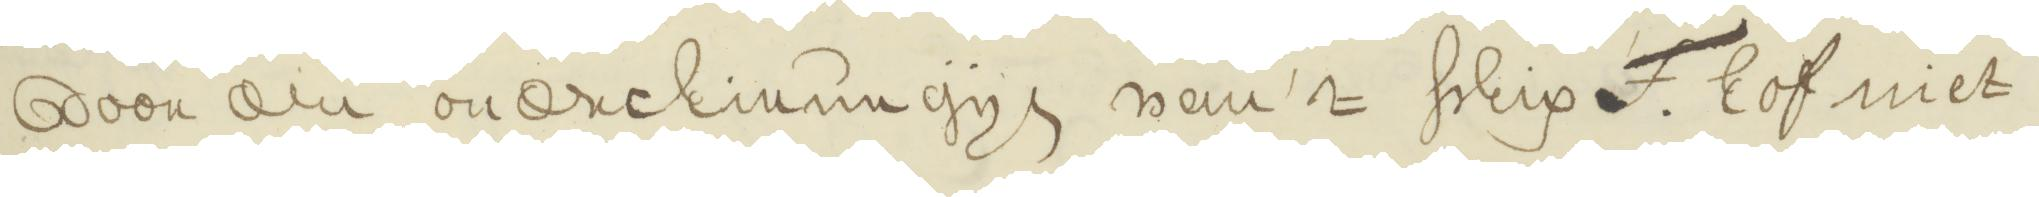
door den onderchirurgijn van't schip 'T. hof niet
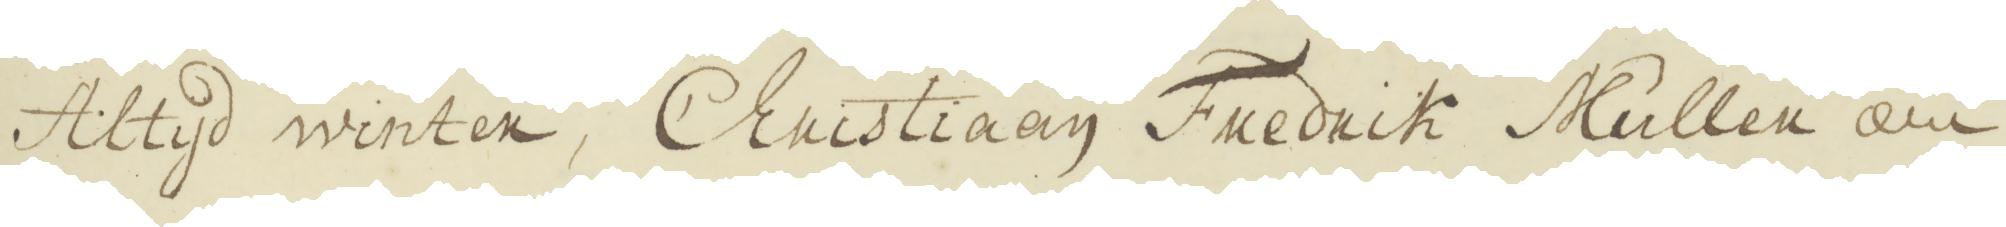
Altijd winter, Christiaan Fredrik Muller den
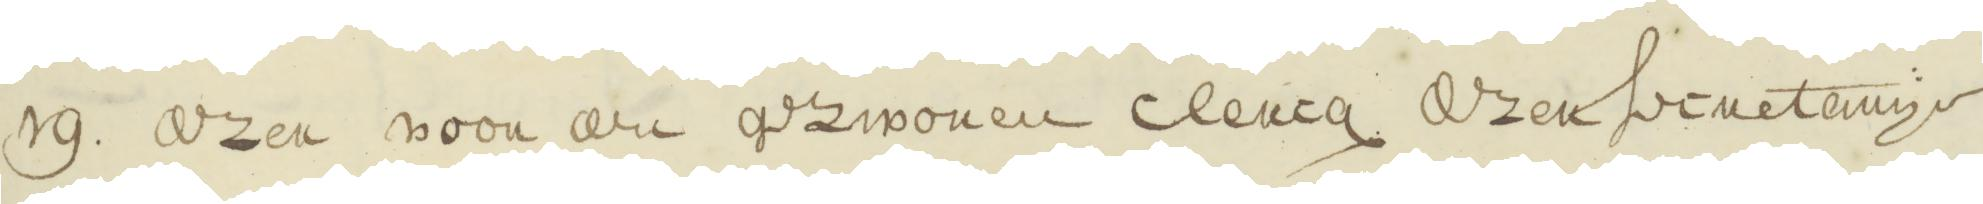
19. dezer voor den gezworen clercq dezer secretarije
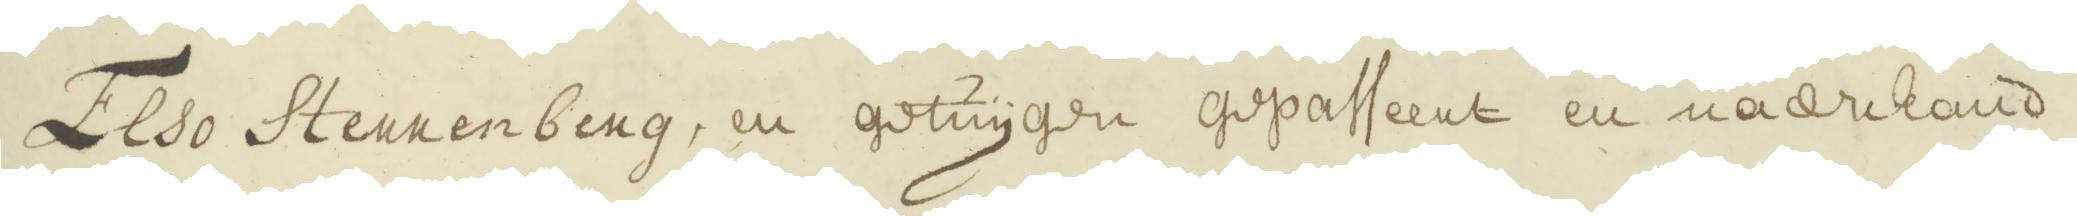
Elso sterrenberg, en getuijgen gepasseert en naderhand
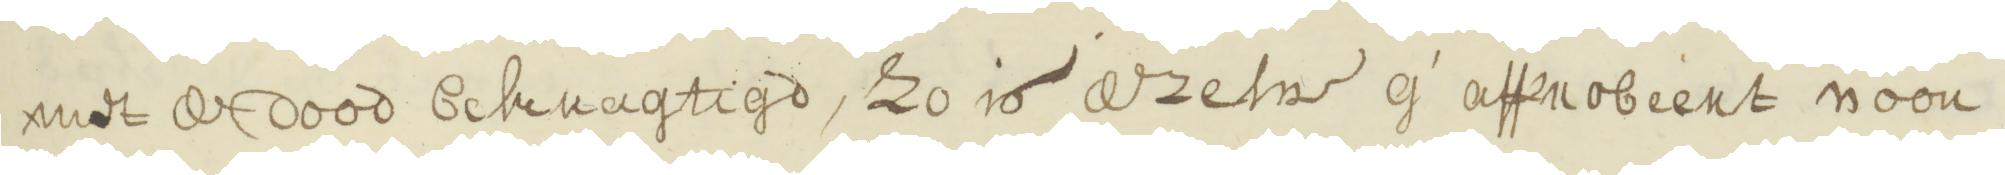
met de dood bekragtigd, zo is dezelve g’approbeert voor
